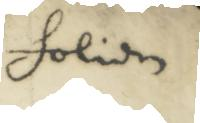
folien
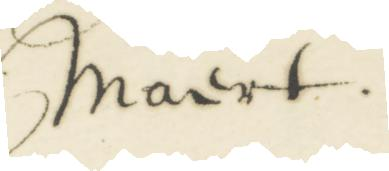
Maert.
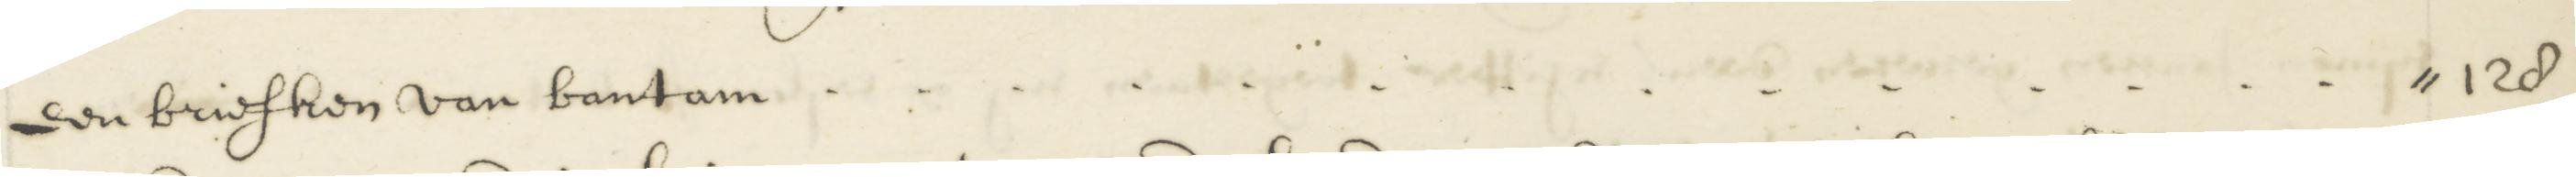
een briefken van bantam - - - - - - - - - - - - - - „ 128
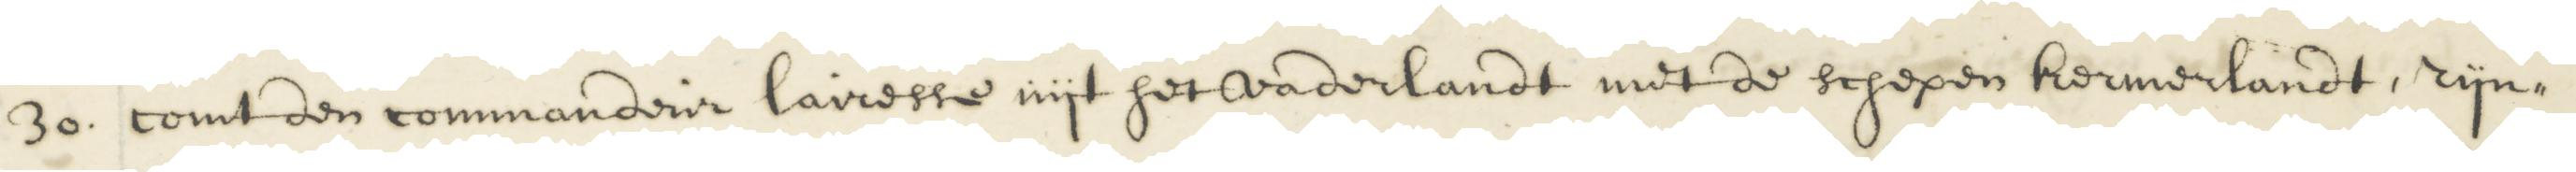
30. comt den commandeur lairesse uijt het vaderlandt met de schepen kermerlandt, rijn„
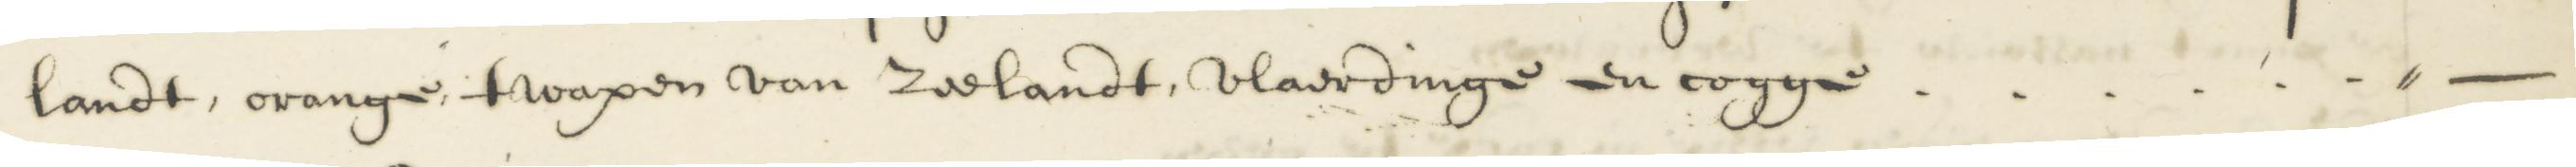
landt, orange ’t wapen van zeelandt, vlaerdinge en cogge - - - - - - „ —
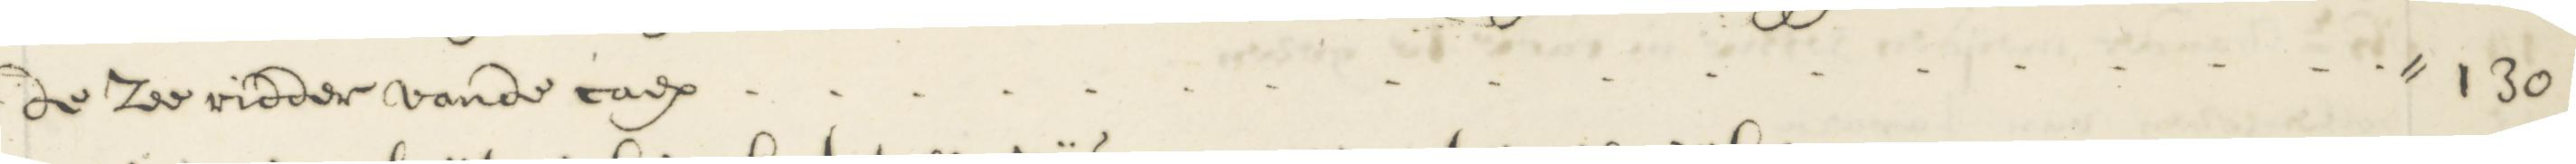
de zee ridder vande caep - - - - - - - - - - - - - - - - - „ 130
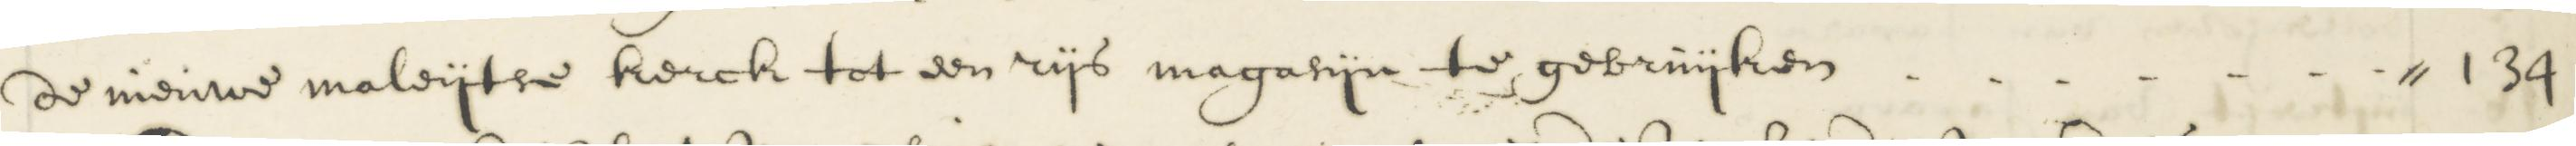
de nieuwe maleijtse kerck tot een rijs magasijn te gebruijken - - - - - - - „ 134
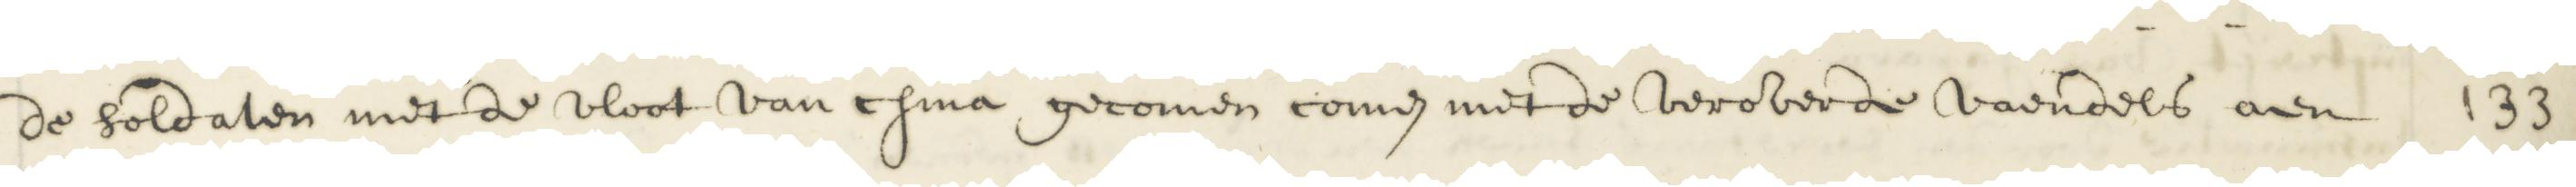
de soldaten met de vloot van china gecomen comen met de veroverde vaendels aen 133
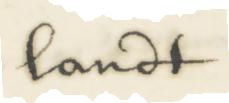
landt
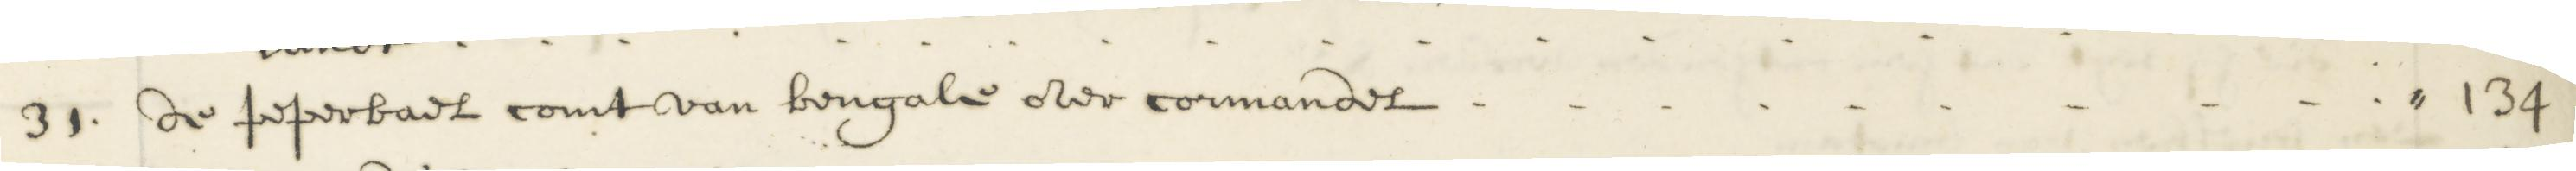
31. de peperbael comt van bengale over cormandel - - - - - - - - - - „ 134
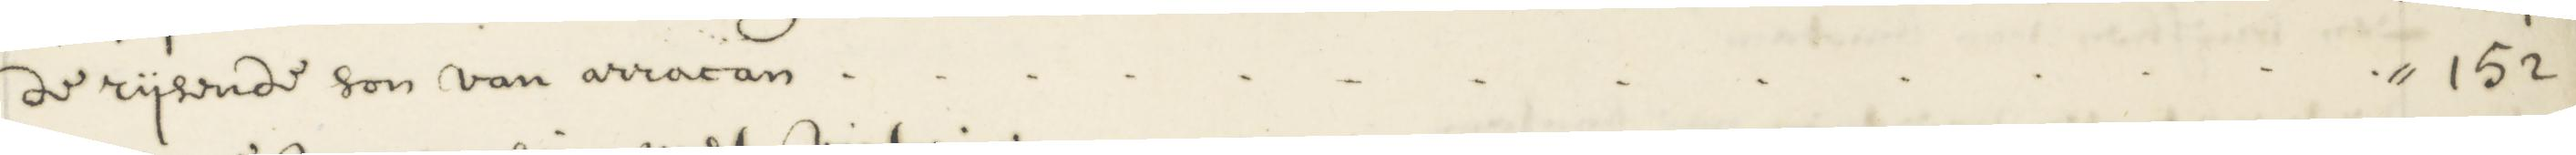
de rijsende son van arracan - - - - - - - - - - - - - -„ 152
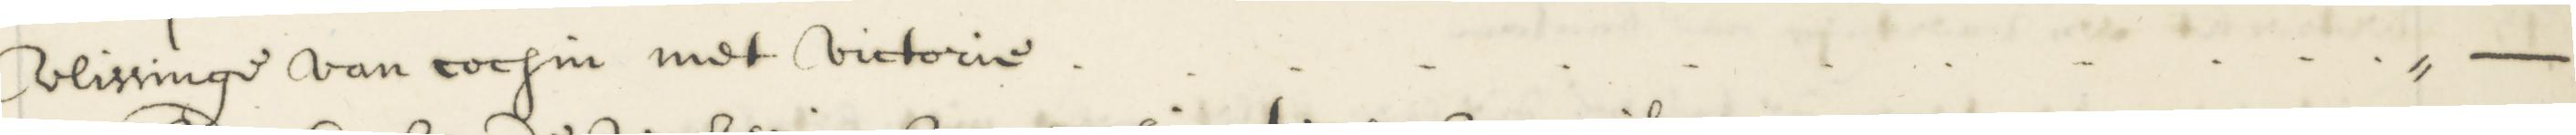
vlissinge van cochin met victorie - - - - - - - - - - - -„ —
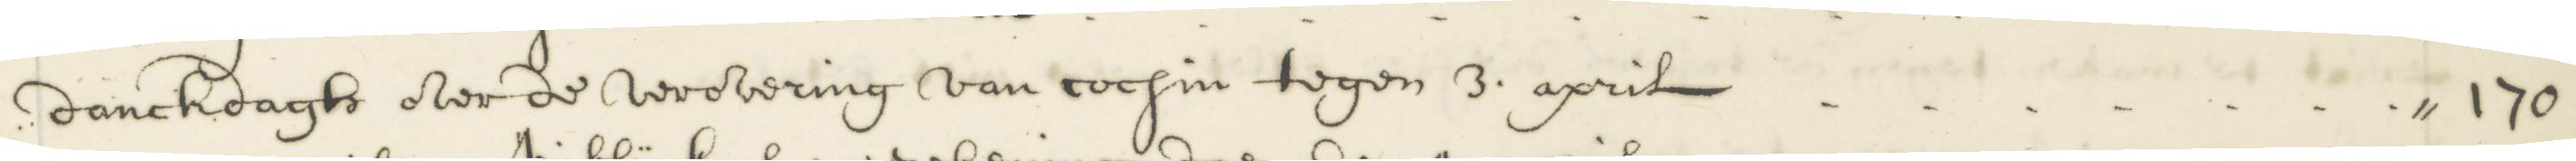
danckdagh over de verovering van cochin tegen 3. april - - - - - - -„ 170
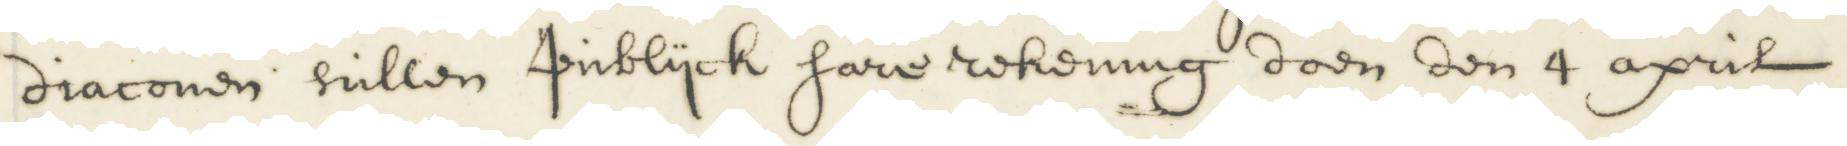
diaconen sullen publijck hare rekening doen den 4 april
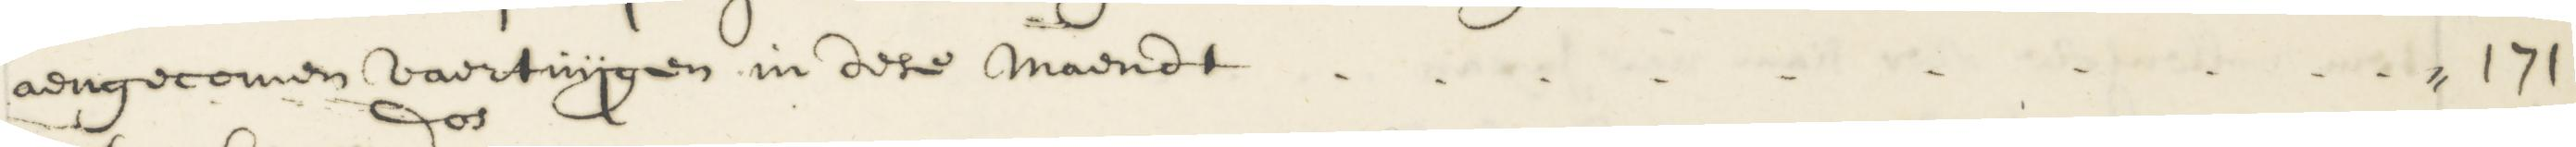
aengecomen vaertuijgen in dese maendt - - - - - - - - - - „ 171
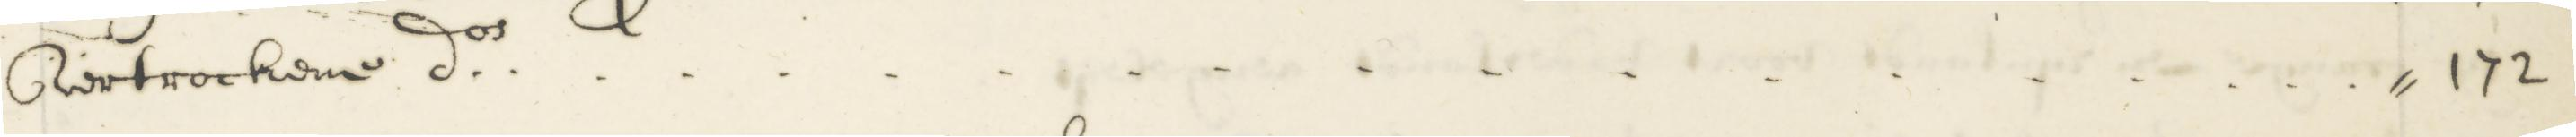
vertrockene d.os - - - - - - - - - - - - - - - - - - - „ 172
